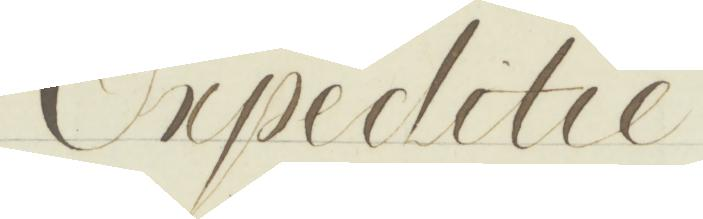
Expeditie
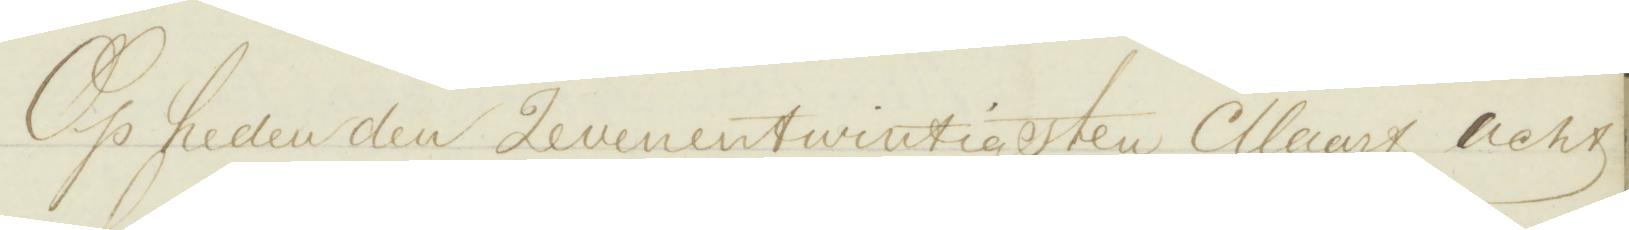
Op heden den Zevenentwintigsten Maart acht
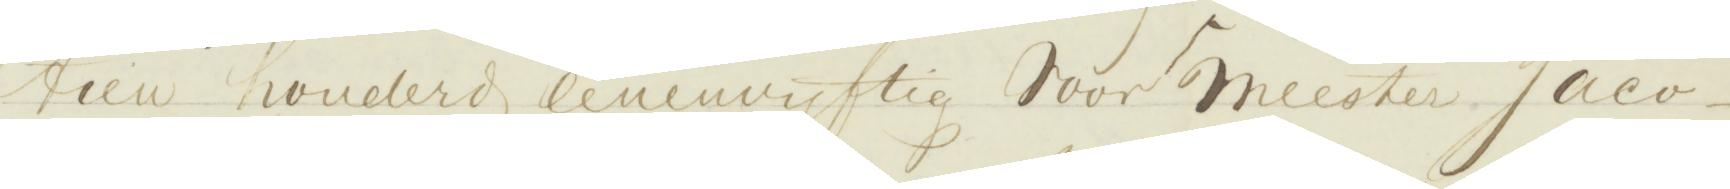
tien honderd eenenvyftig Voor ¶ Meester Jaco
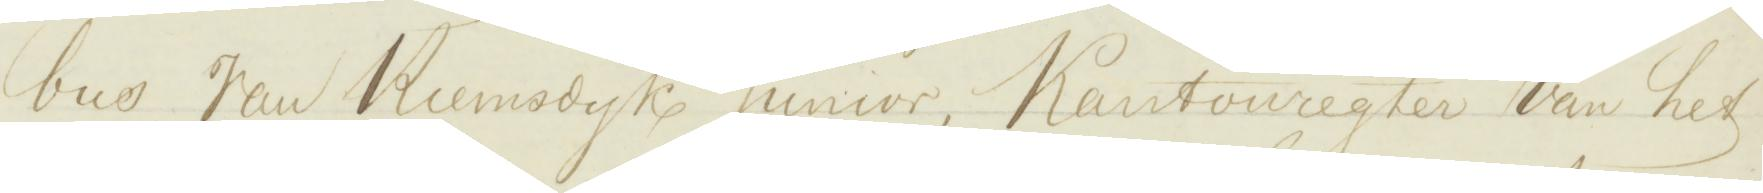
bus van Riemsdyk Junior, Kantonregter van het
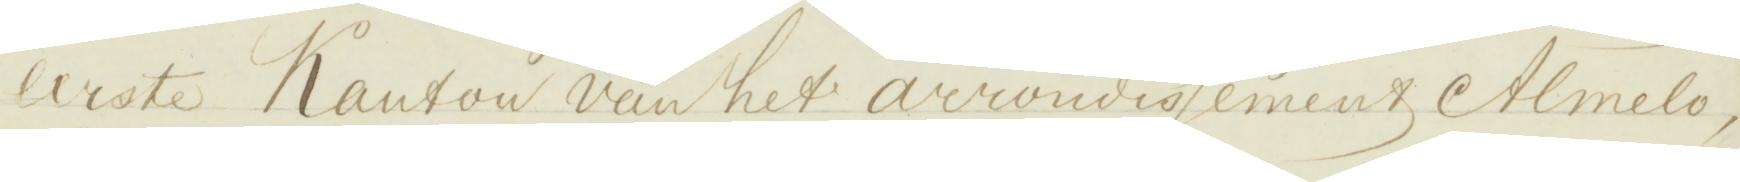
eerste Kanton van het Arrondissement Almelo,
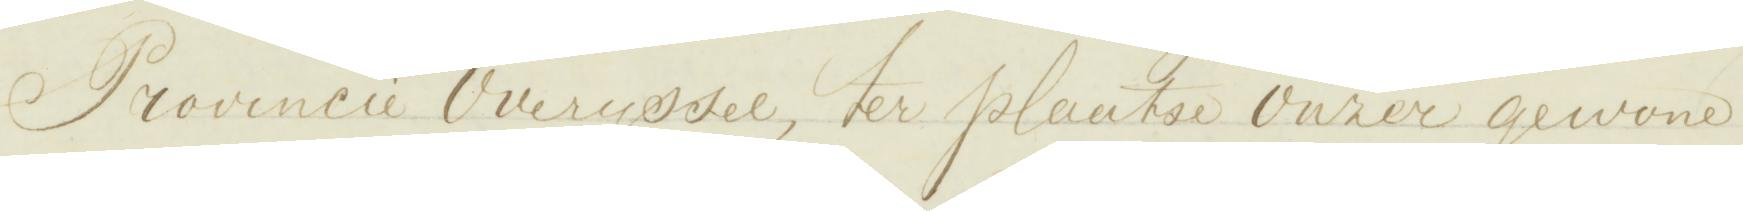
Provincie Overyssel, ter plaatse onzer gewone
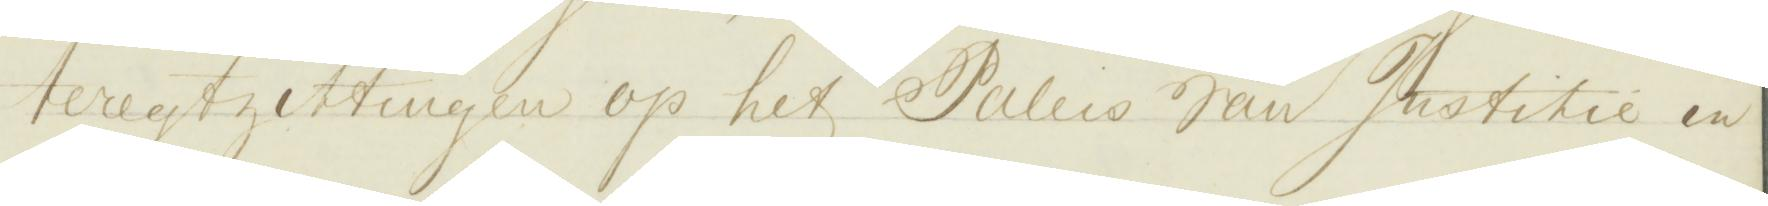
teregtzettingen op het Paleis van Justitie in
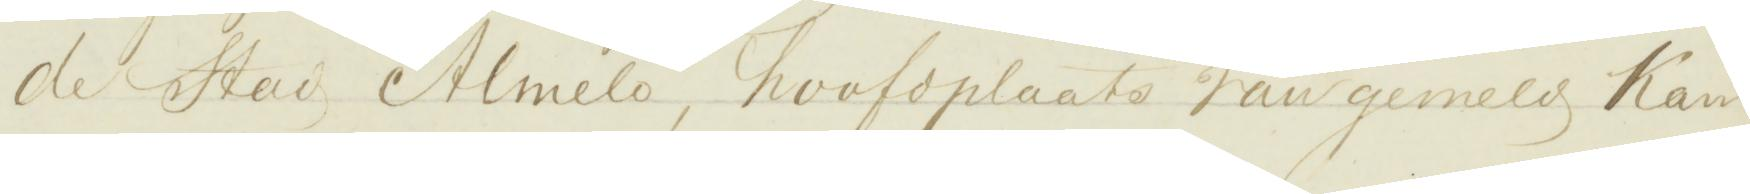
de stad Almelo, hoofdplaats van gemeld Kan
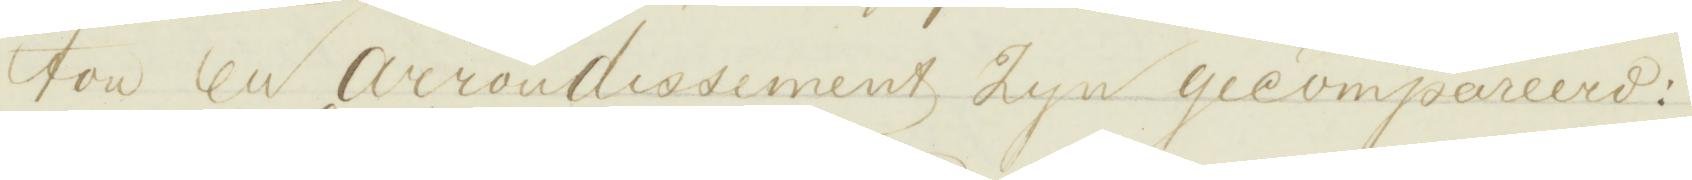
ton en Arrondissement Zyn gecompareerd:
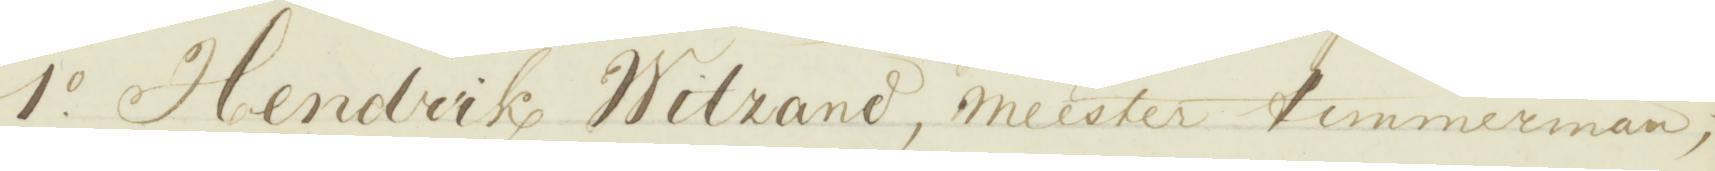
1.o Hendrik Witzand, meester Timmerman;
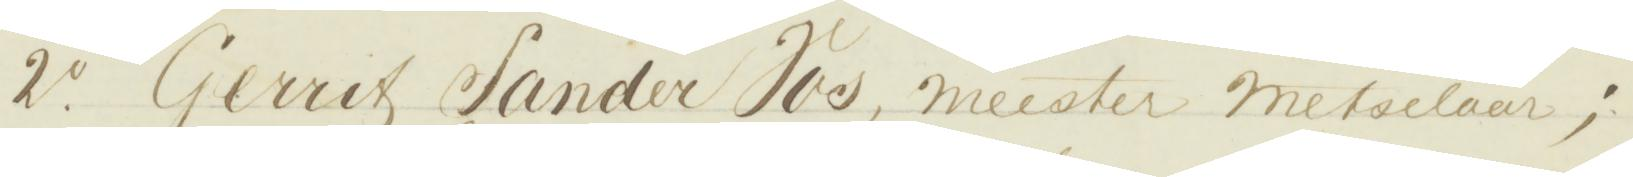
2.o Gerrit Sander Vos, meester metselaar;
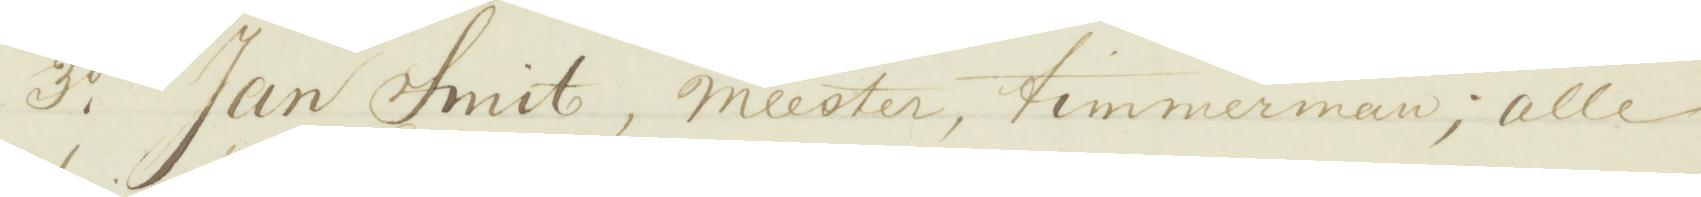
3.o Jan Smit, meester, timmerman; alle
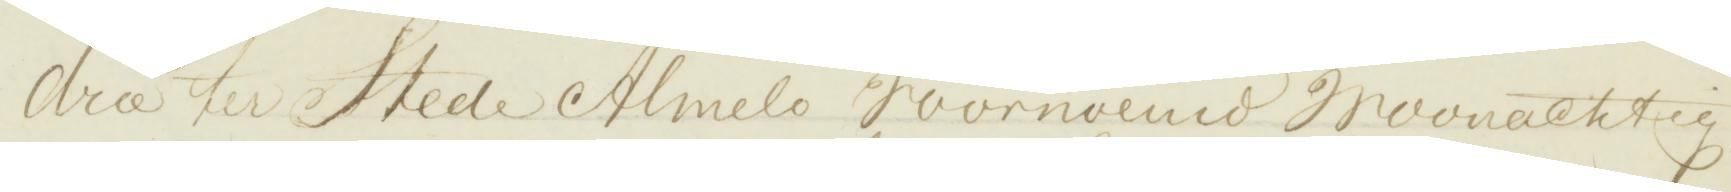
drie ter Stede Almelo voornoemd woonachtig
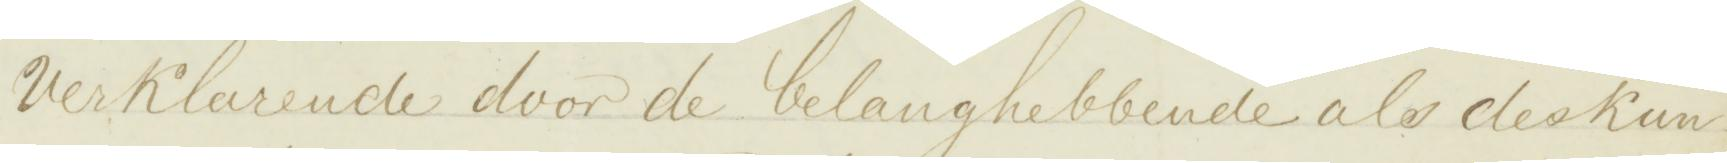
verklarende door de belanghebbende als deskun
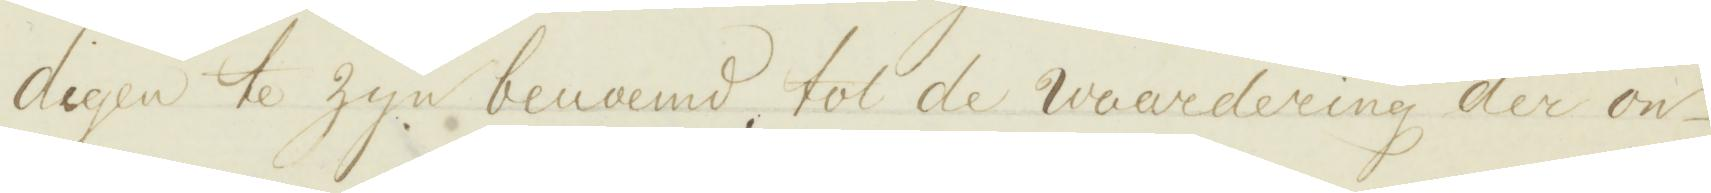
digen te zyn benoemd, tot de waardering der on=
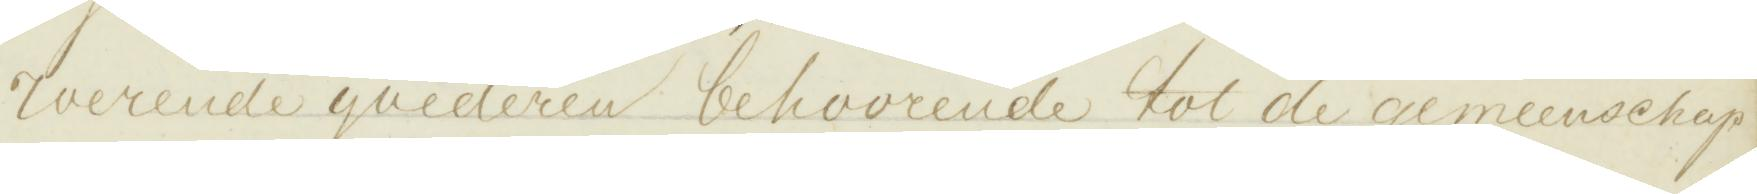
roerende goederen behoorende tot de gemeenschap
